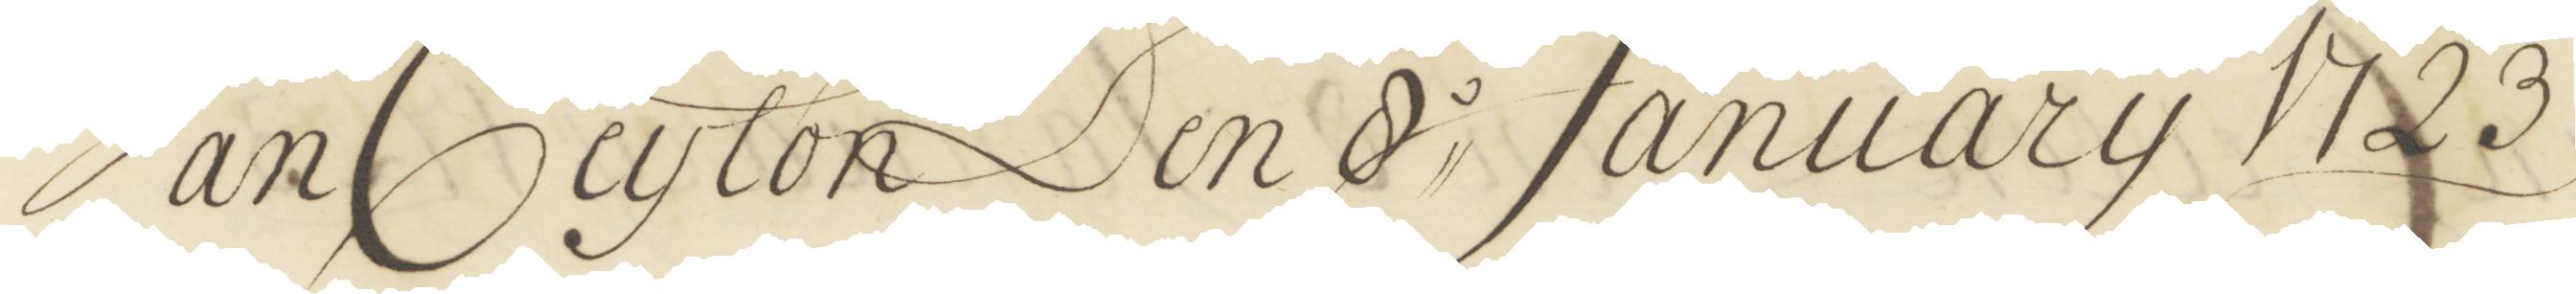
Van Ceylon Den 8„' Januarij 1723
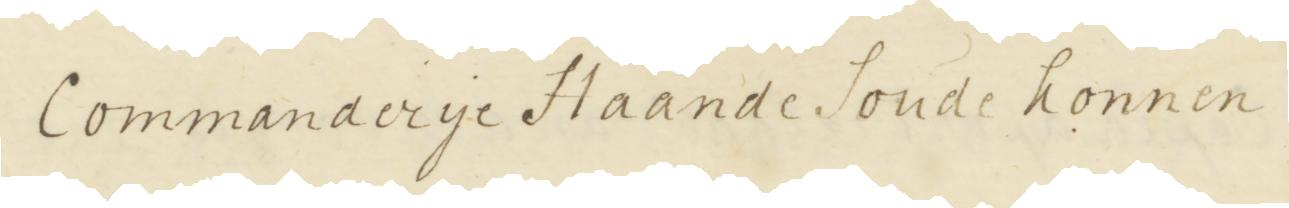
Commanderije staande soude konnen
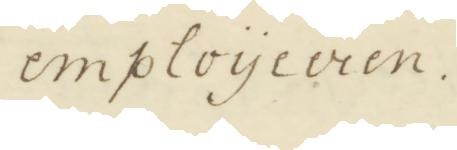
emploijeeren.
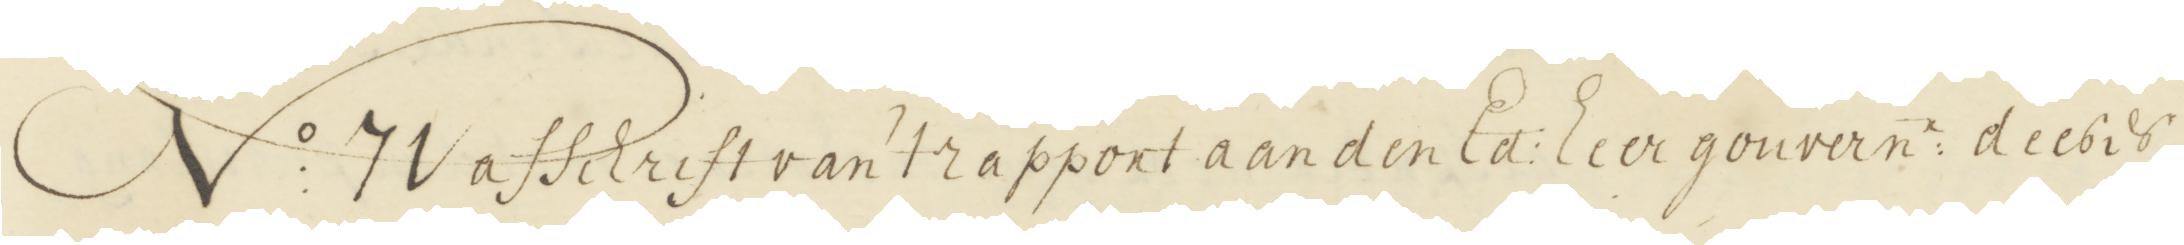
N:o 71 afschrift van ’t rapport aan den Ed: heer gouvern:r deeses
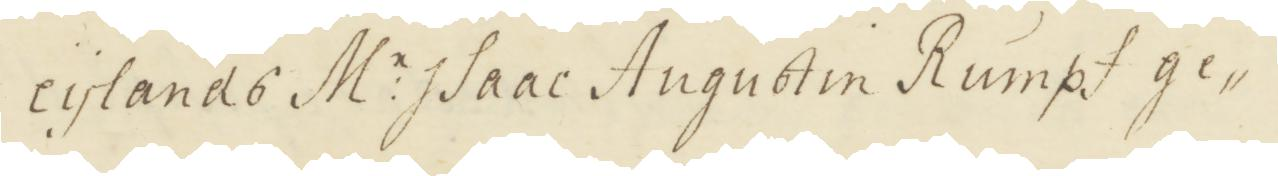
eijlands M:r Jsaac Augustin Rumpf ge„
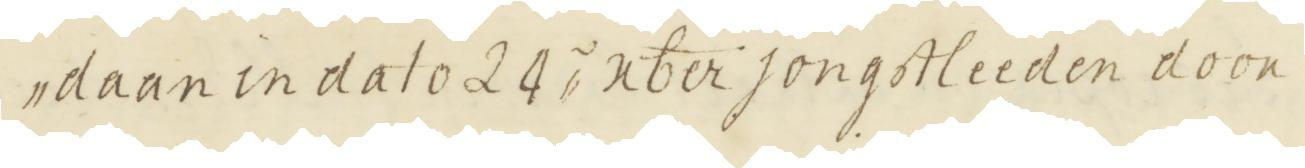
„daan in dato 24„' xber jongstleeden door
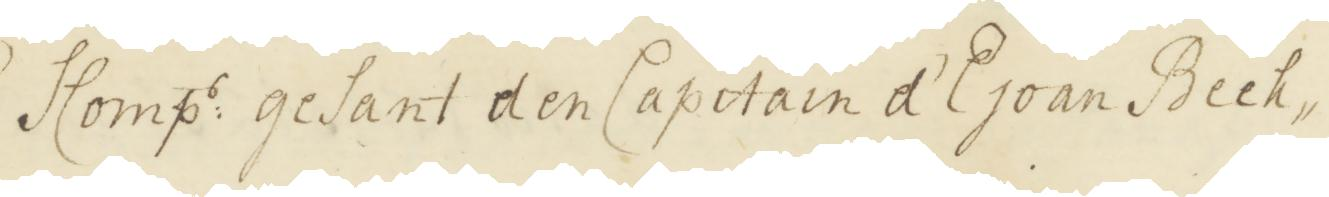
'sComp:s gesant den Capitain d' E joan Beek„
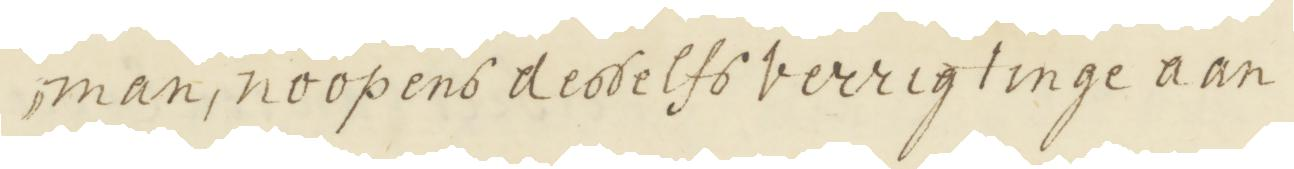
„man, noopens desselfs verrigtinge aan
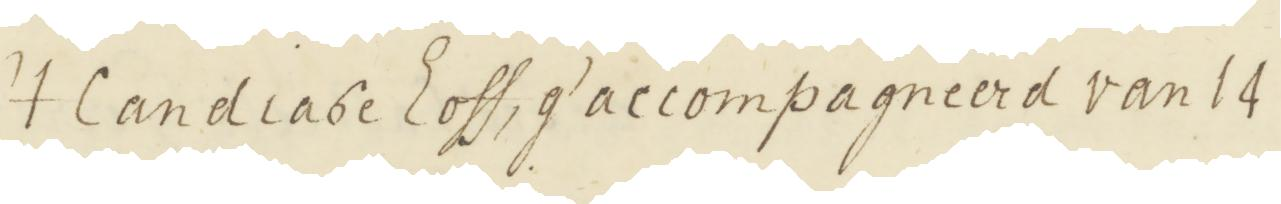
’t Candiase hoff, g’accompagneerd van 14
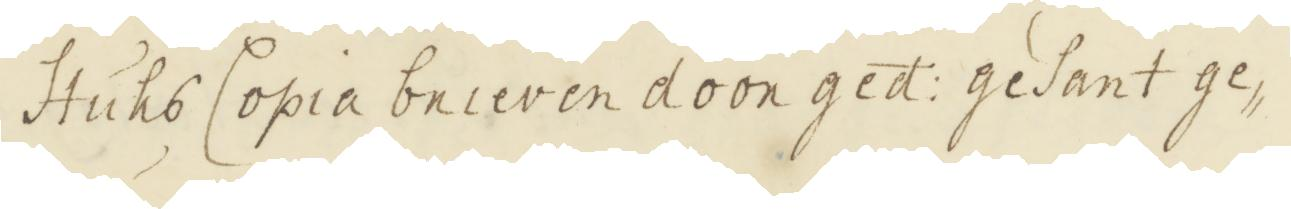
stuks Copia brieven door ged: gesant ge„
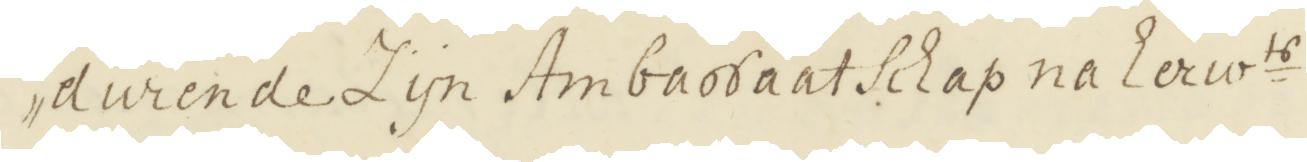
„durende zijn Ambassaatschap na herw=ts
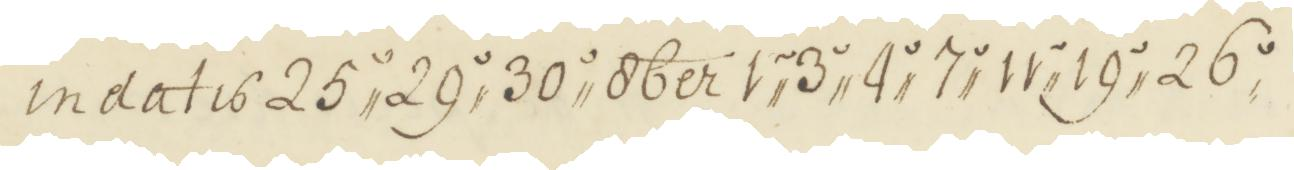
in datis 25„' 29„' 30„' 8ber 1„' 3„' 4„' 7„' 11„' 19„' 26„'
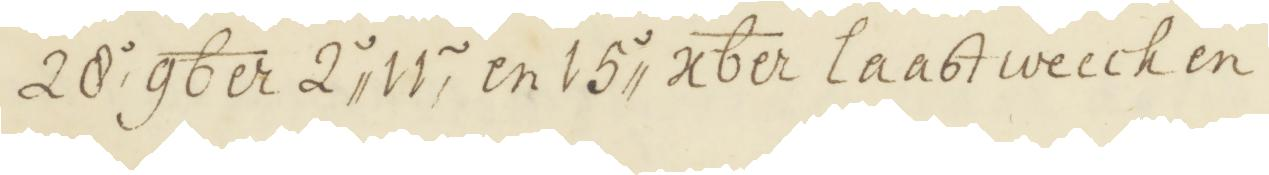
28„' 9ber 2„' 11„' en 15„' xber laast weecken
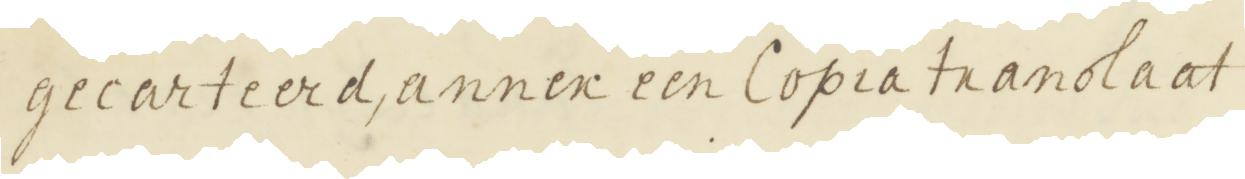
gecarteerd, annex een Copia translaat
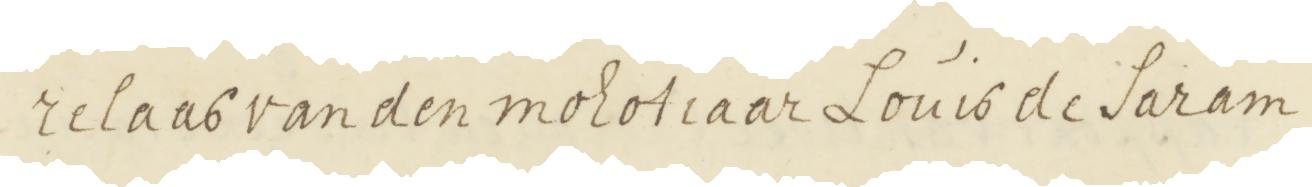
relaas van den mohotiaar Louis de Saram
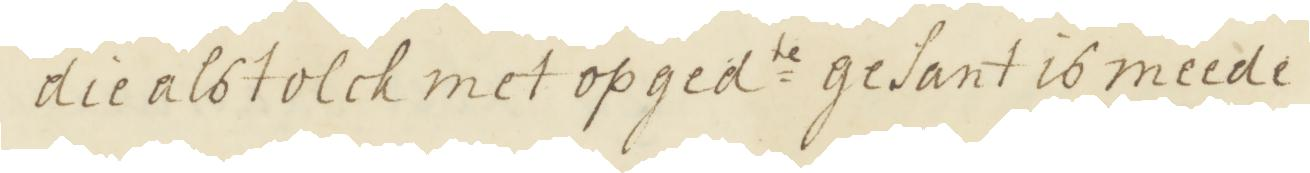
die als tolck met opged=te gesant is meede
